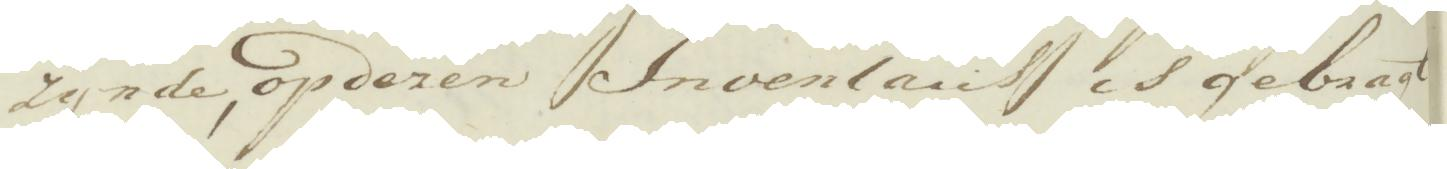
zynde, op dezen Inventaris is gebragt
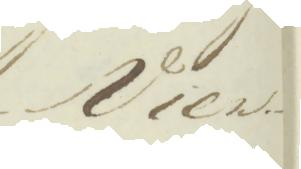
Vier. -
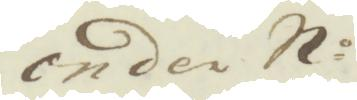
onder N=o
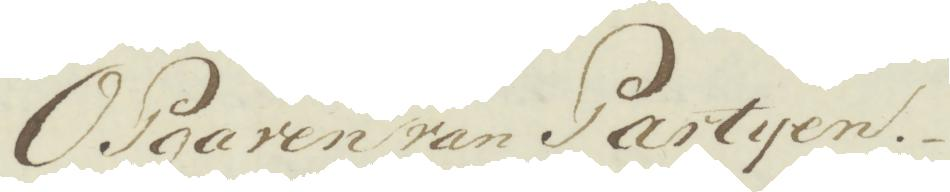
OPgaven van Partyen.
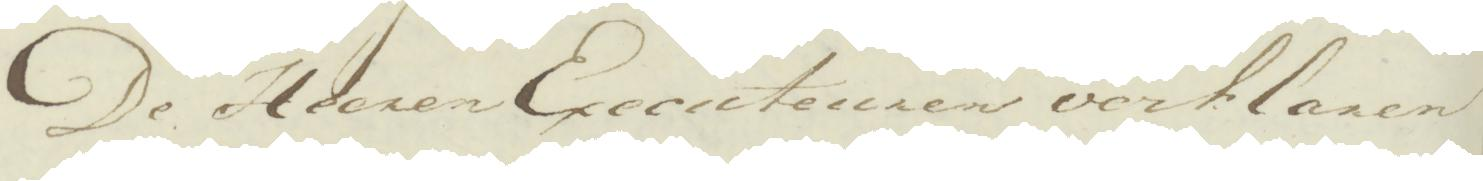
De Heeren Executeeeren verklaren
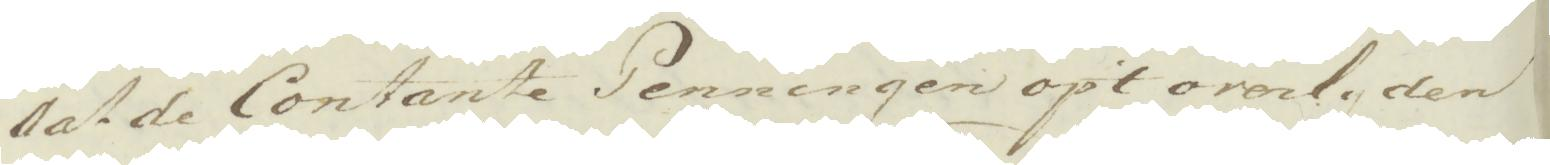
dat de Contante Penningen op 't overlyden
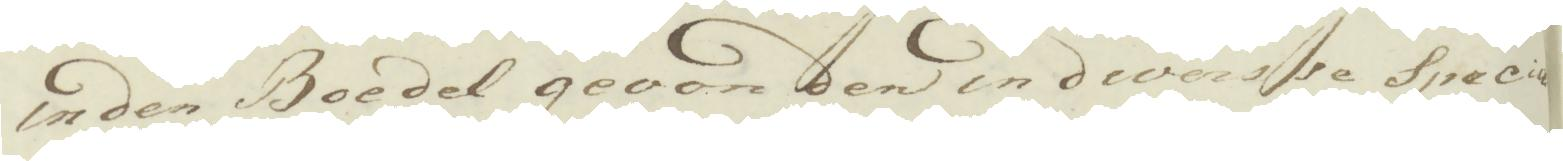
in den Boedel gevonden in diversse Specia
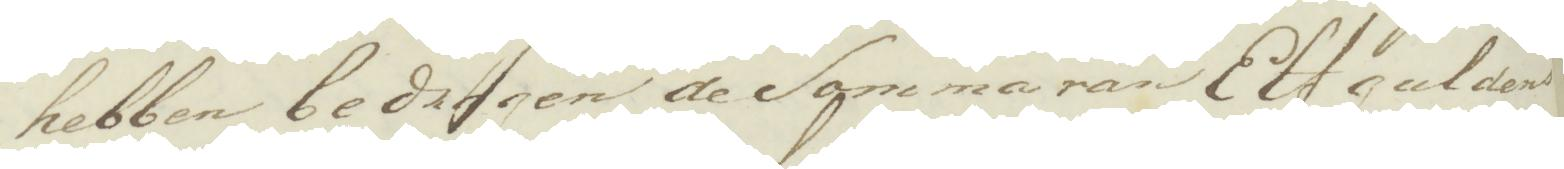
hebben bedragen de Somma van Elf guldens
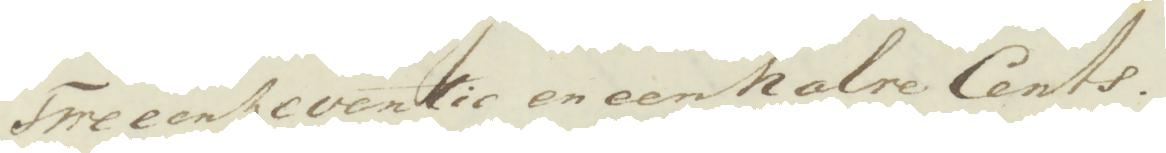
Tweeenzeventig en een halve Cents.
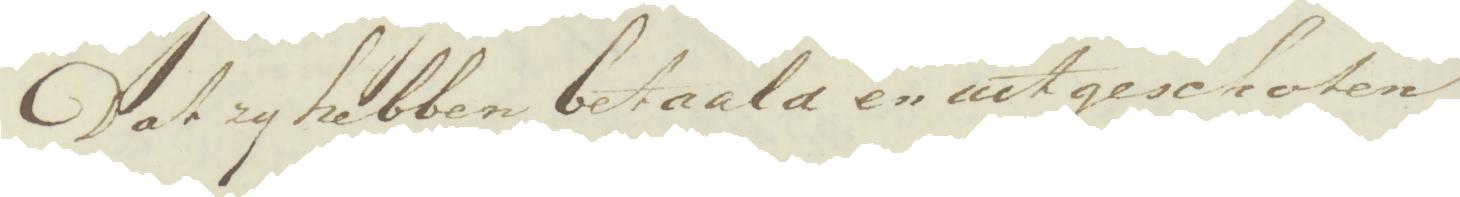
Dat zy hebben betaald en uitgeschoten
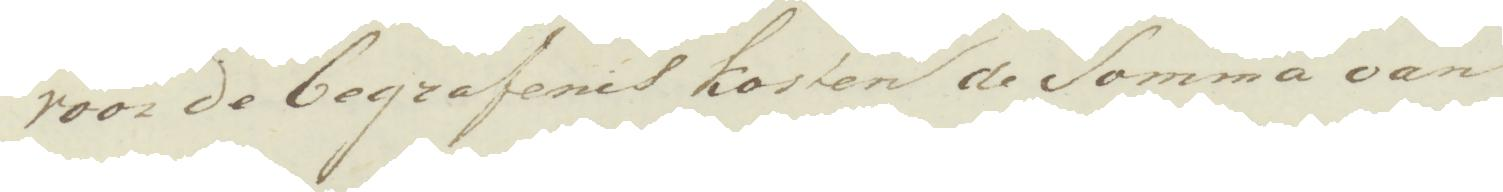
voor de begrafenis kosten de somma van
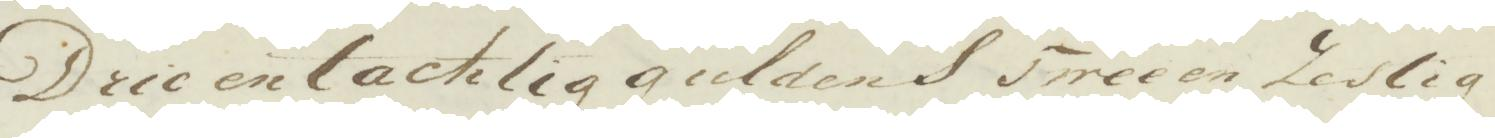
Drie en tachtig guldens Twee en Zestig
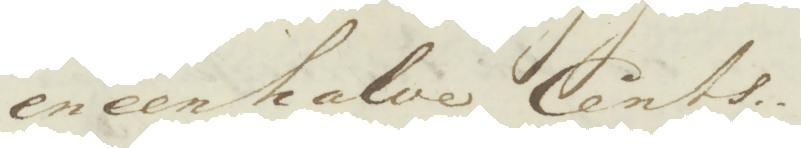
en een halve Cents. .
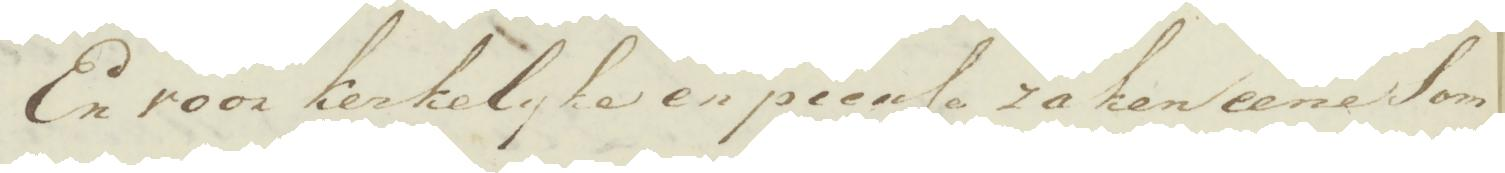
En voor kerkelyke en piense zaken eene Som
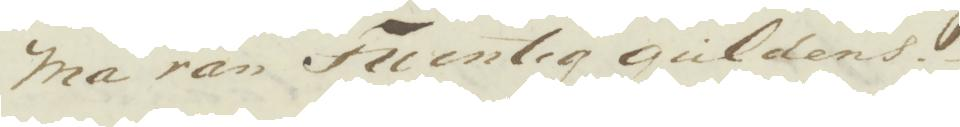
ma van Twintig guldens.
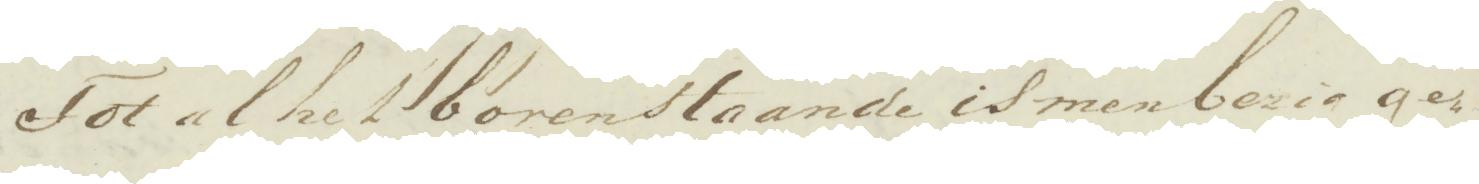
Tot al het bovenstaande is men bezig ge„
